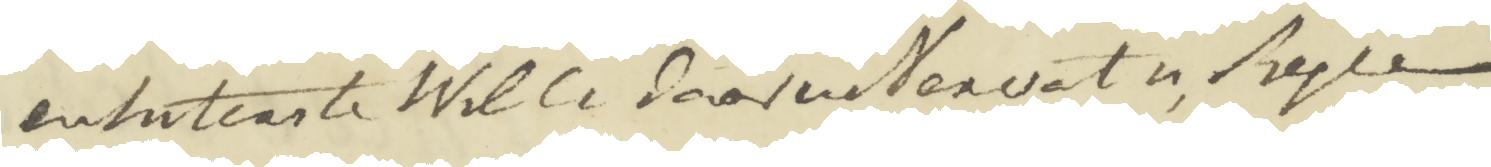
en Uiterste Wille daarin Vervat is, Regte
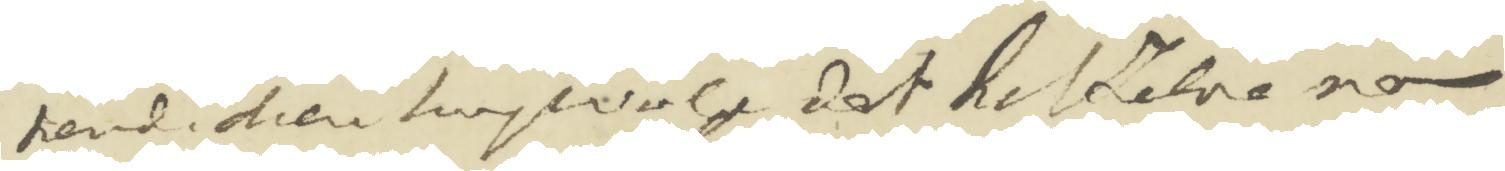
kend dien tweentwintig dat het zelve na
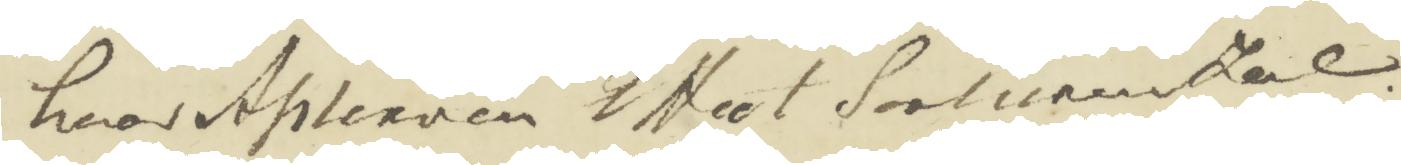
haar Afsterven Effect sorteeren zal
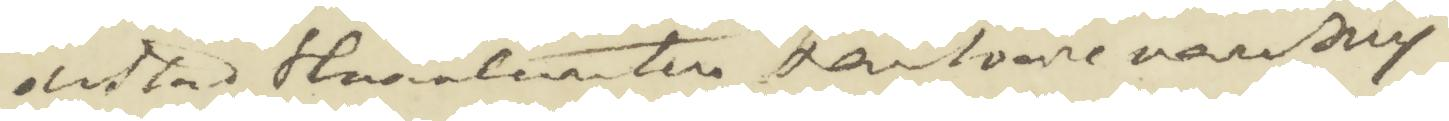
destad Haarlem ten kantoore van my
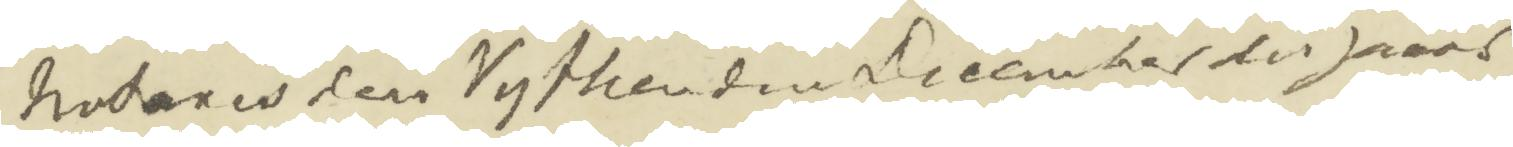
Notaris den Vijftienden December des Jaars
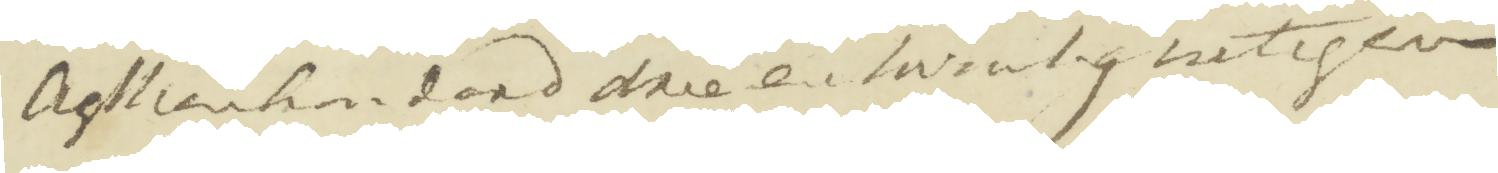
Agttien honderd drie en twintig netigen
